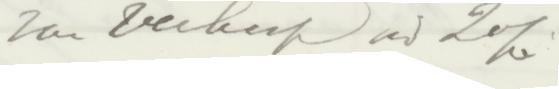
van verkoop ad 2%
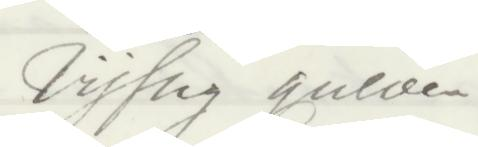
Vijftig gulden
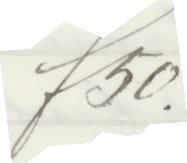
ƒ50.
